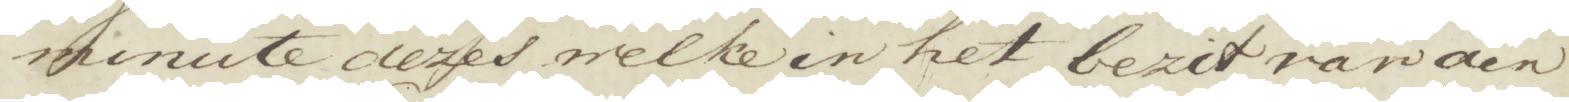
minute dezes welke in het bezit van den
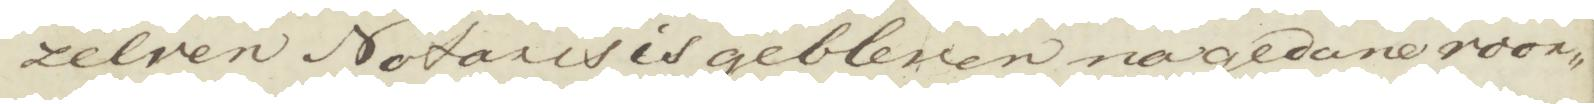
zelven Notaris is gebleven nagedane voor„
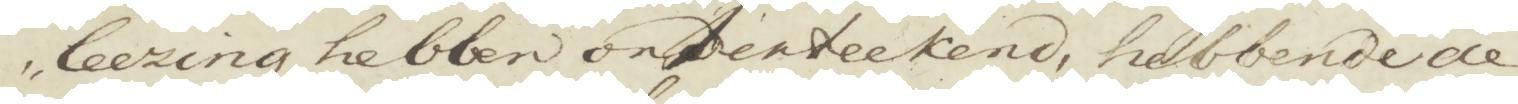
„leezing hebben onderteekend, hebbende de
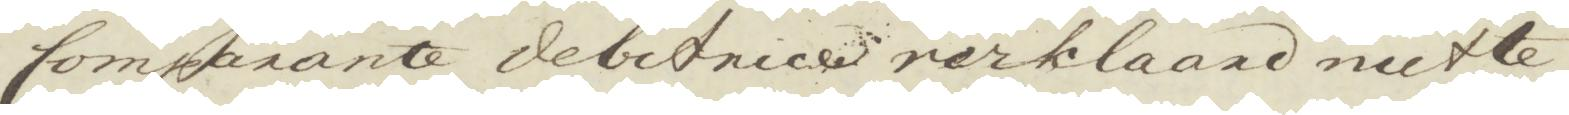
Comparante debitrice verklaard niet te
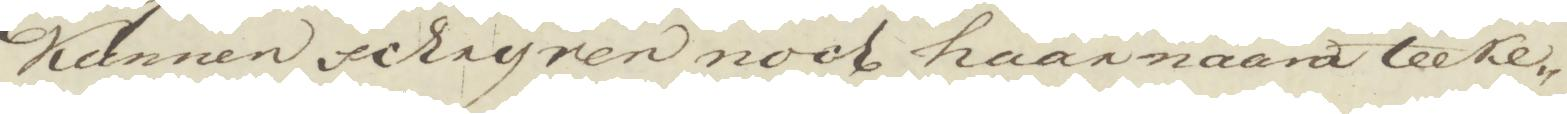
Kunnen schryven noch haar naam teeke„
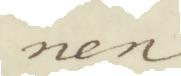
nen
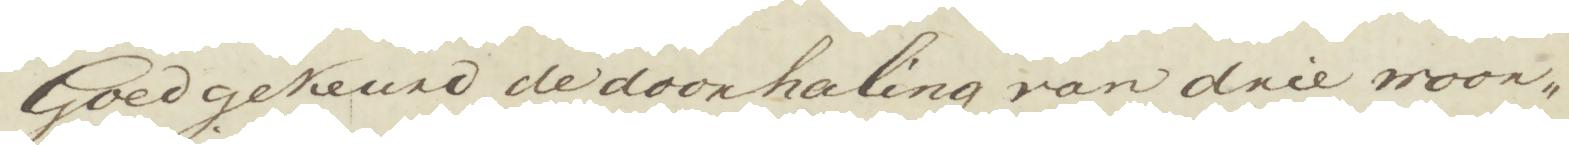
Goedgekeurd de doorhaling van drie woor„
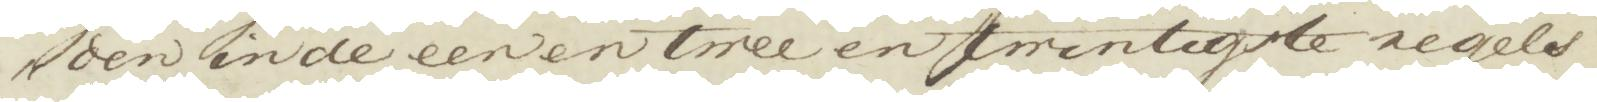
„den in de een en twee en twintigste regels
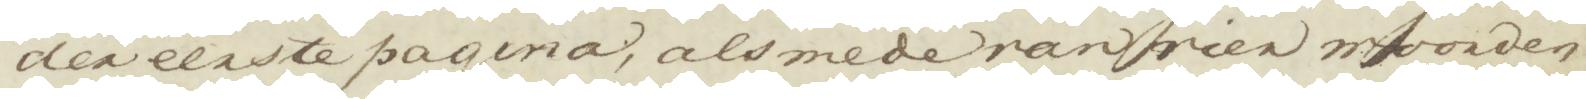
der eerste pagina, als mede van vier woorden
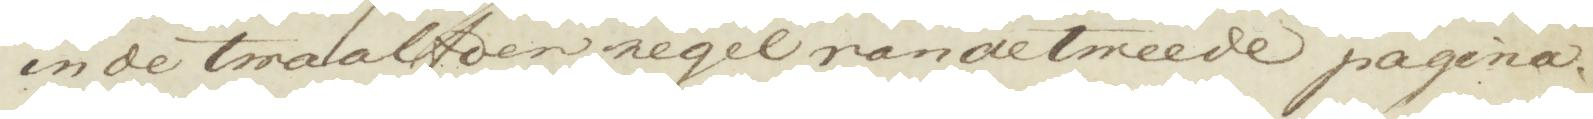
in de twaalfden regel van de tweede pagina„
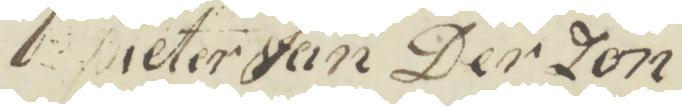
Pieter van Der Zon
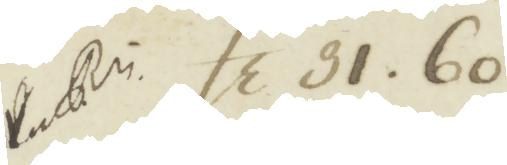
ErRu. fr 31. 60
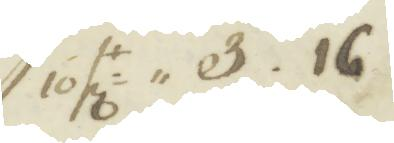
10 pc=t „ 3. 16.
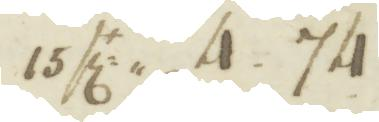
15 pc=t „ 4. 74
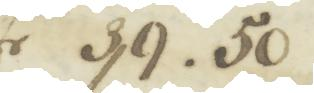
fr 39. 50
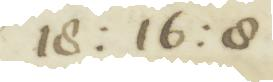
18:16: 8
